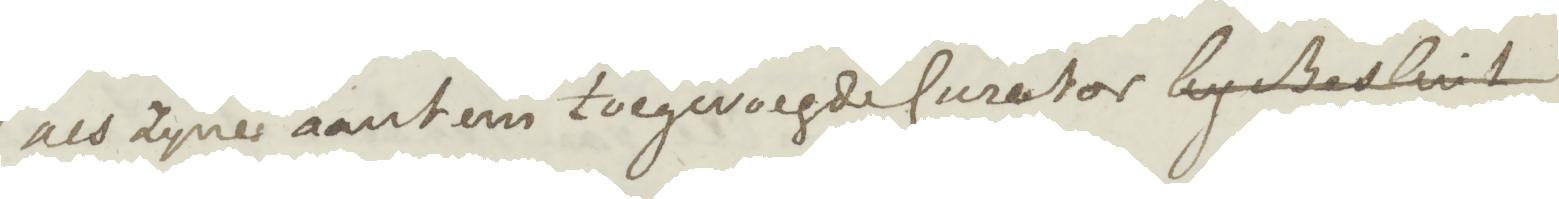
als zyne aan hem toegevoegde Curator by Besluit
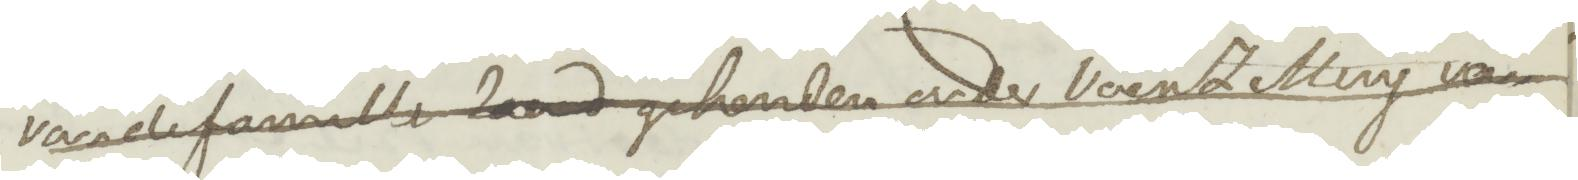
van de famille raad gehenken onder voerzetting van
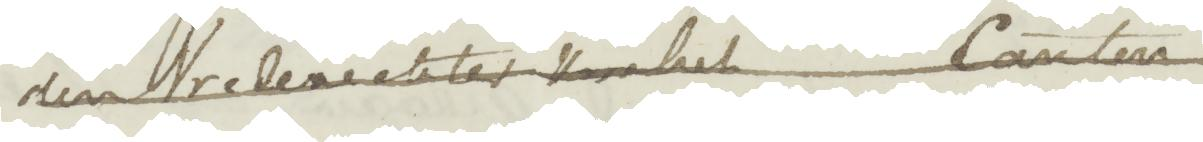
den Vredensaktes van het Canton
